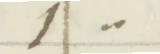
1 ..
